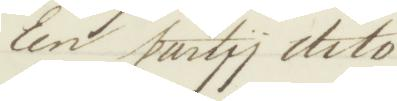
Een partij dito
